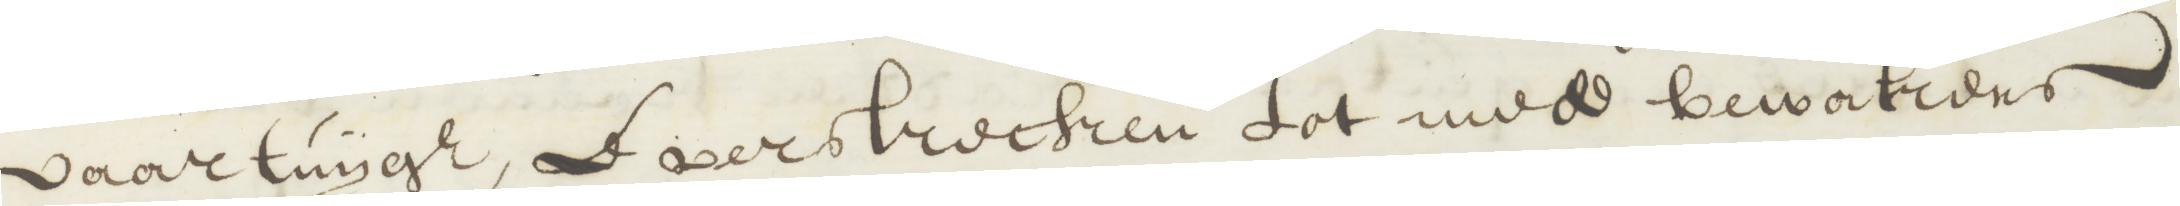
vaartuijgh, te verstrecken tot mede bewakers
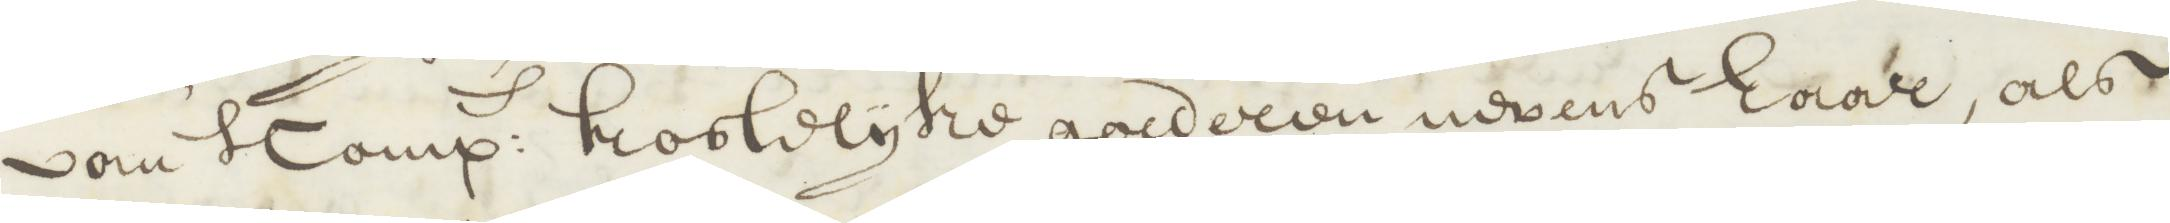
van ’s Comp:s kostelijke goederen nevens haar, als
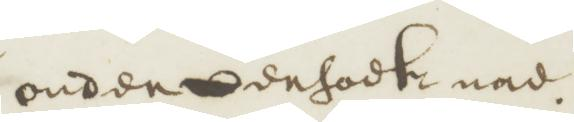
onder versoek nae
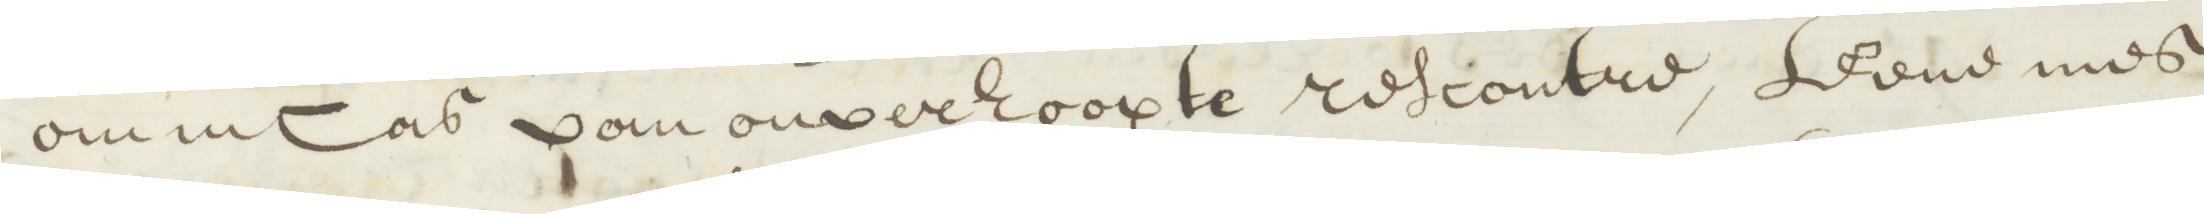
om in Cas van onverhoopte rescontre, teene mes
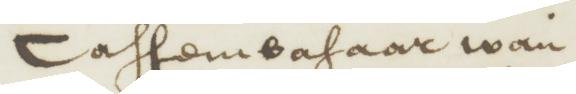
Cassembasaar wan
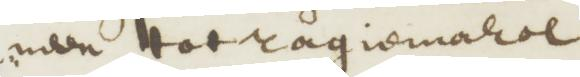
„neer tot ragiemahol
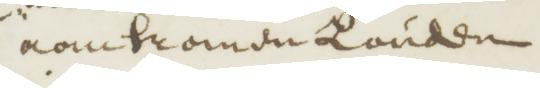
aankomen zouden
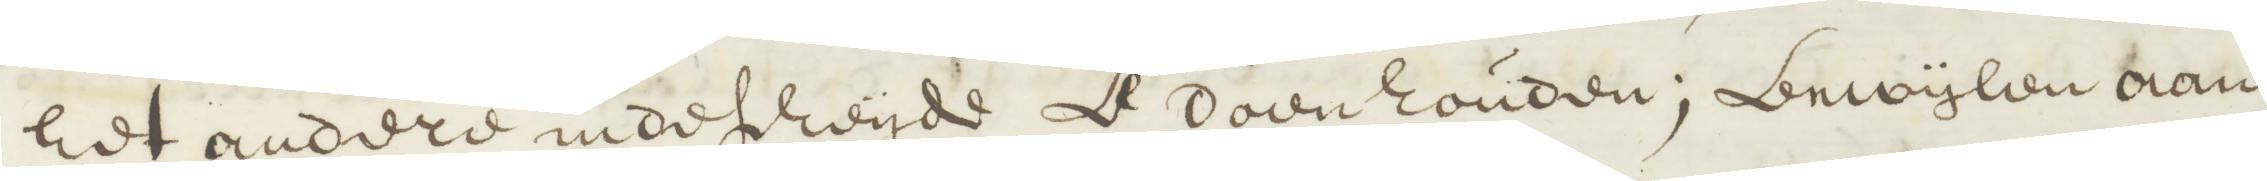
het andere in descheijde te doen houden; terwijlen aan
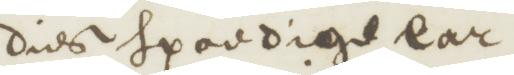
dies spoedige lar
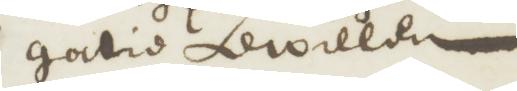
gatie tewillen
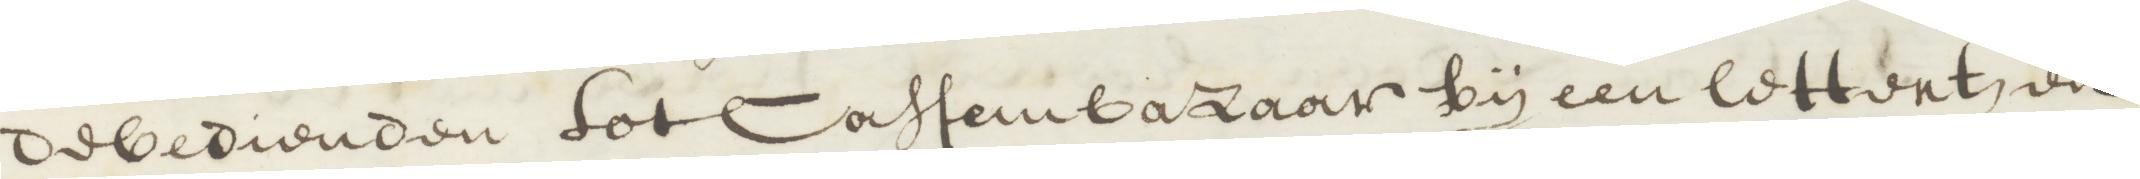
de bedienden tot Cassembazaar bij een lettertjen
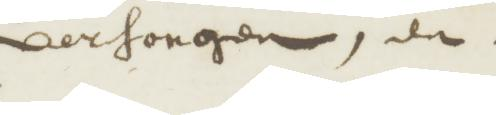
versorgen, en
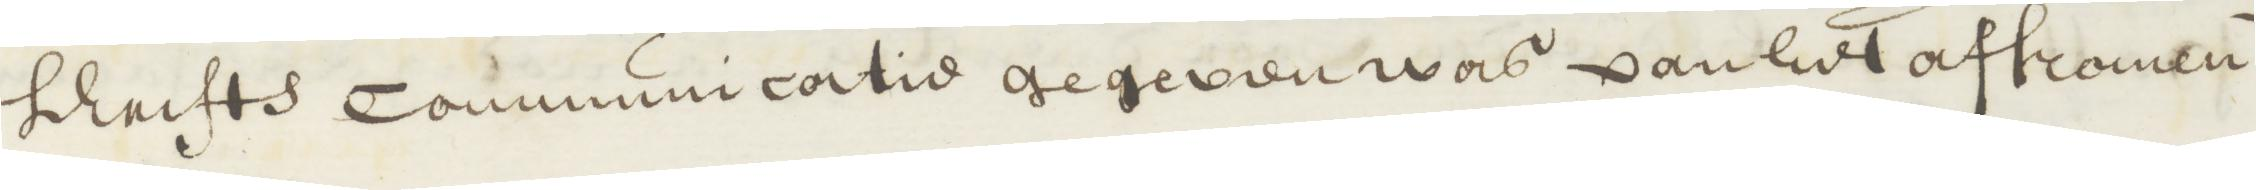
schrifts communicatie gegeven was van het afkomen
